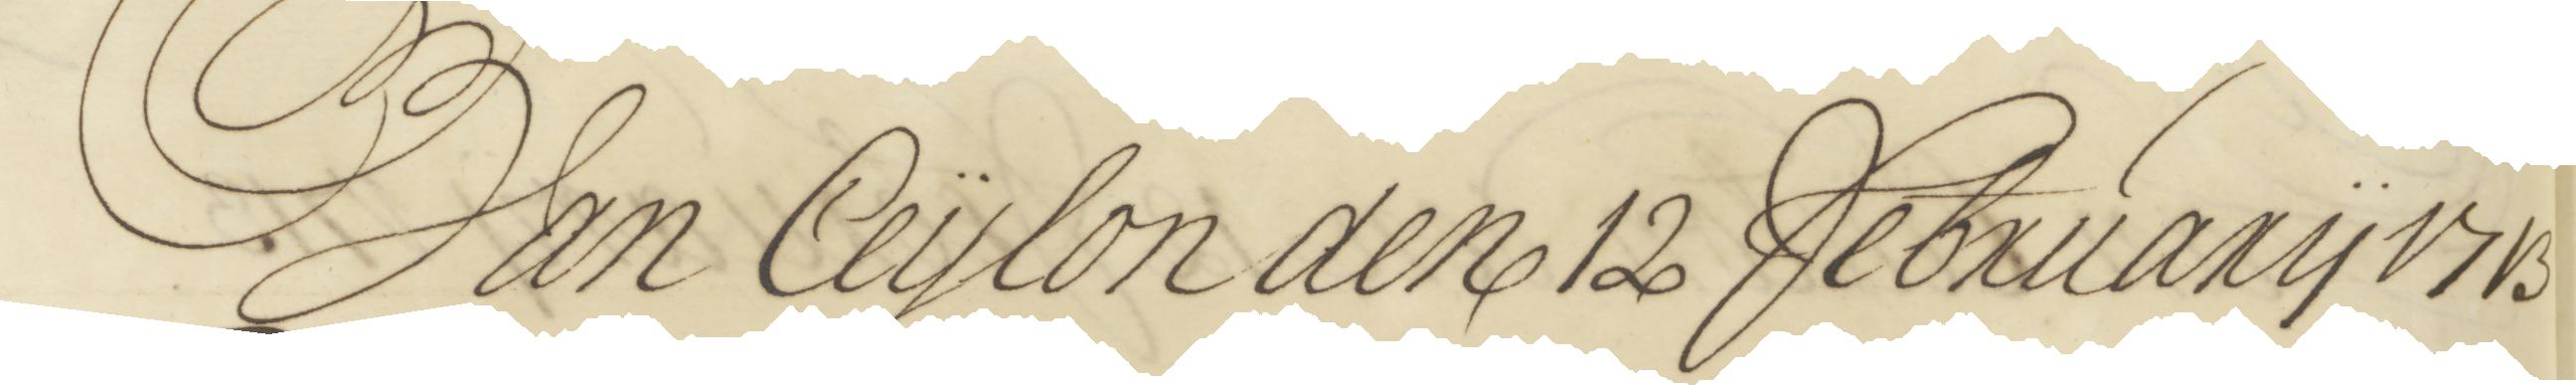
Van Ceijlon den 12 februarij 1713
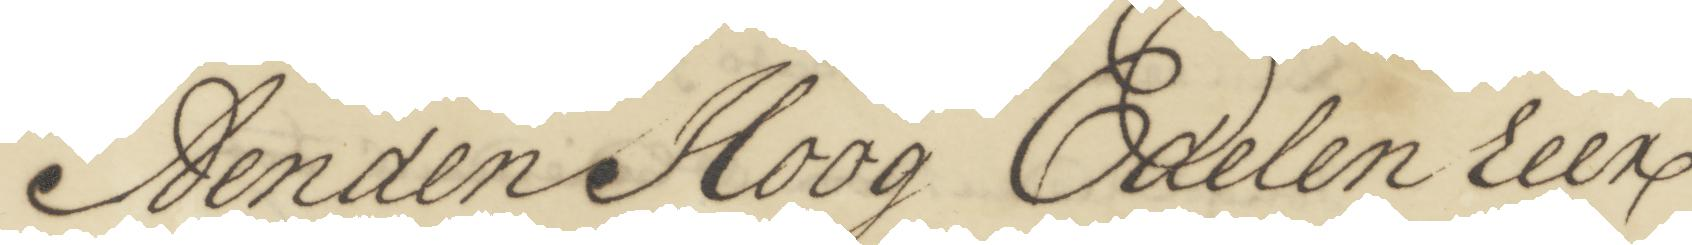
Aenden Hoog Edelen heer
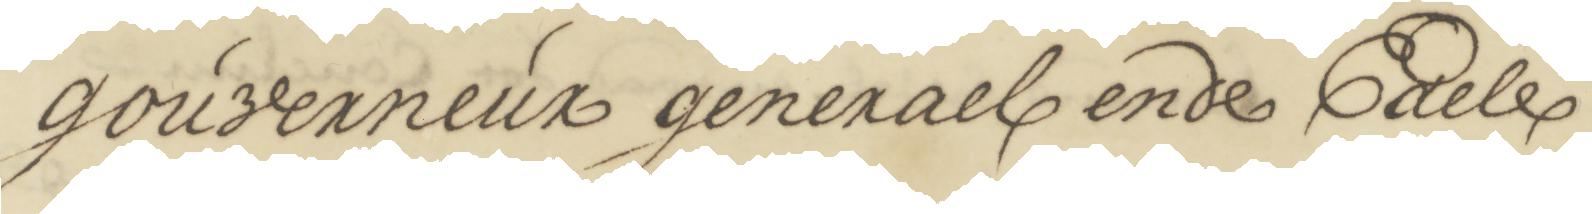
gouverneur generael en de Edele
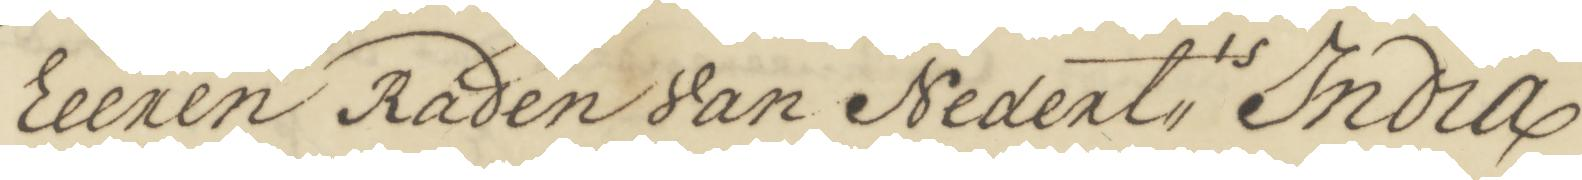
heeren Raden van Nederl„ts India
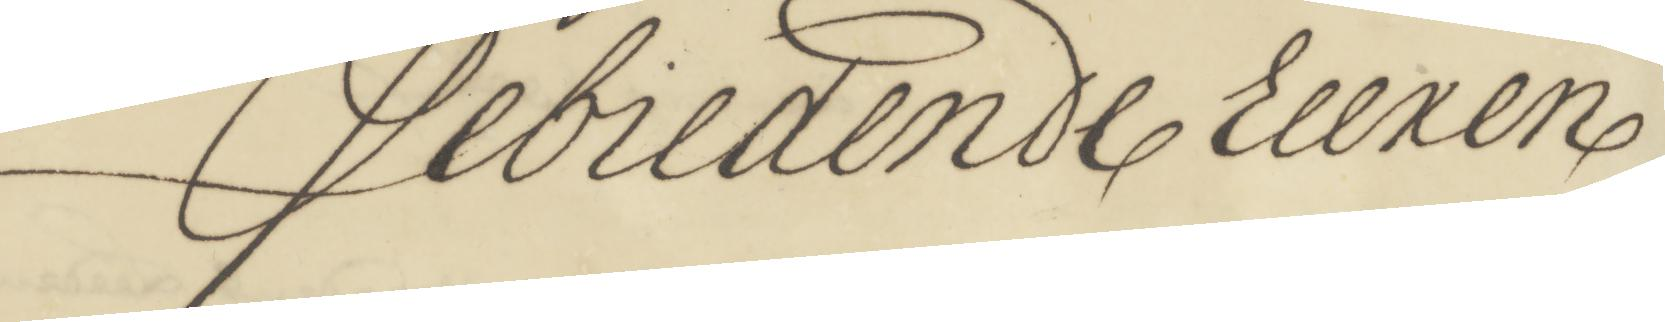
Gebiedende heeren
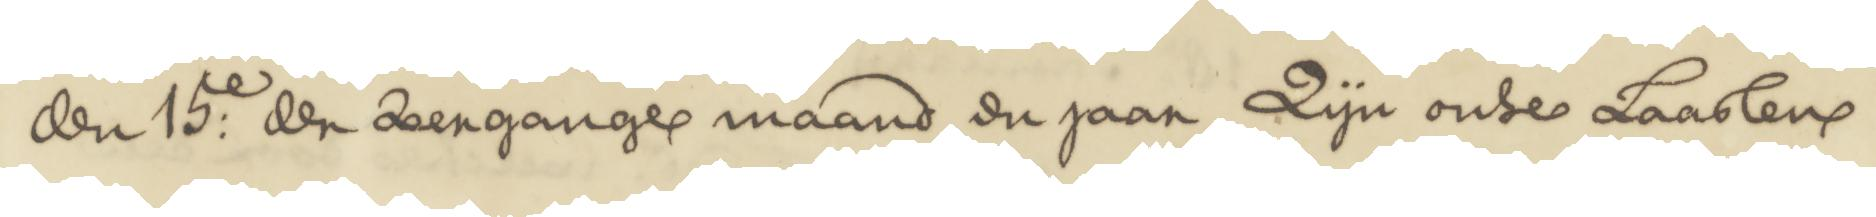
den 15:e der vergange maand en jaar zijn onse Laasten
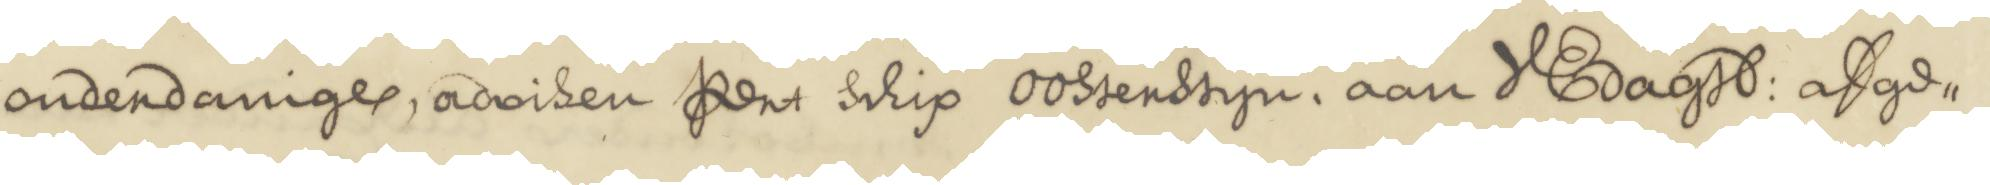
onderdanige, advisen pert schip oosterstijn, aan VEdagtb: afge„
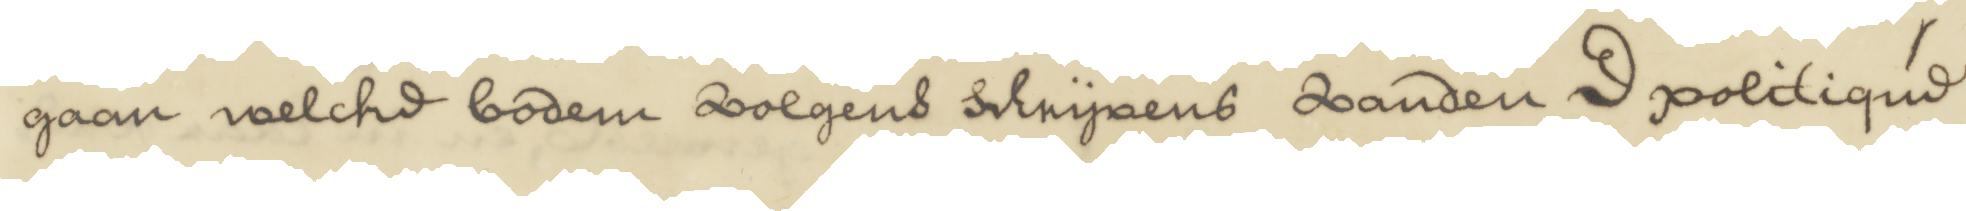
gaan welcke bodem volgens schrijvens vanden E politique
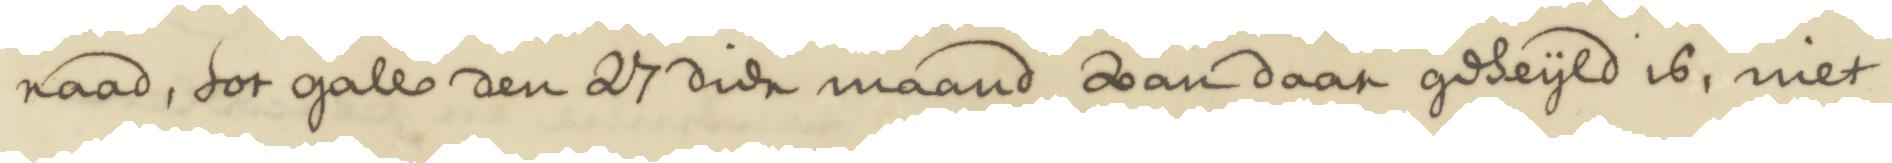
raad, tot gale den 27 dier maand van daar geseijld is, niet
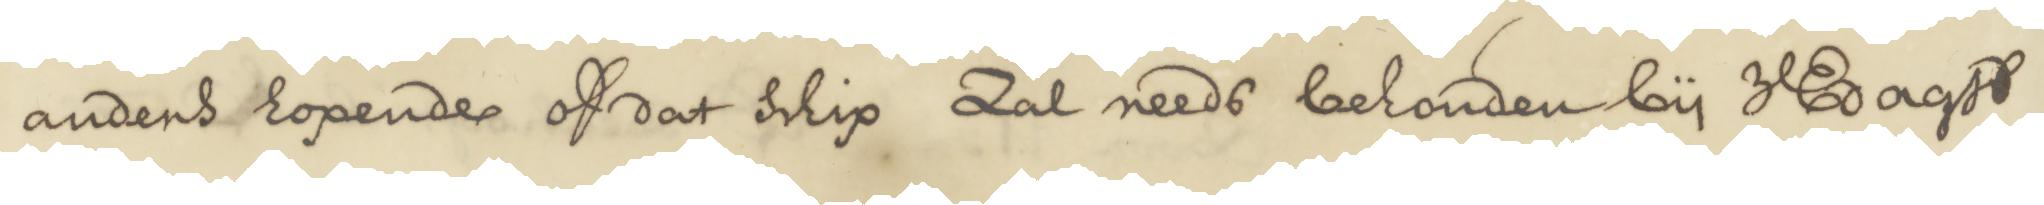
anders hopende of dat schip zal reeds behouden bij VEd agtb
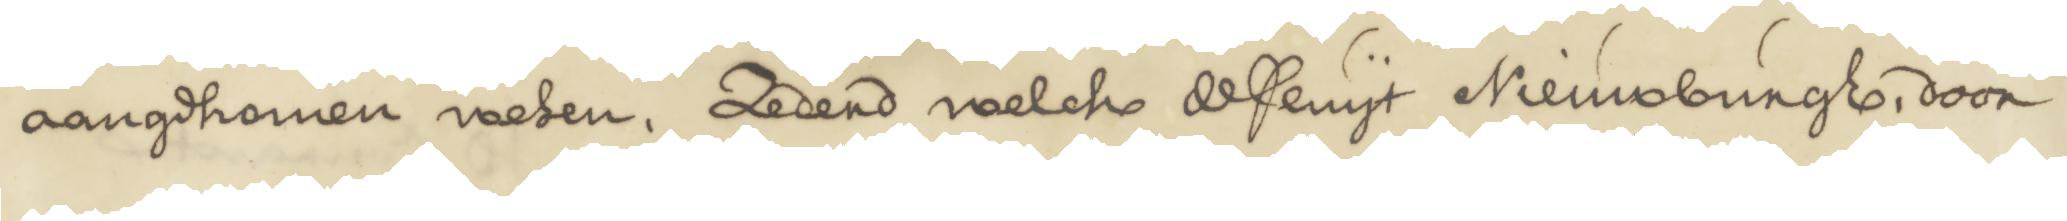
aangekomen wesen, zederd welck defluijt Nieuwburgh, door
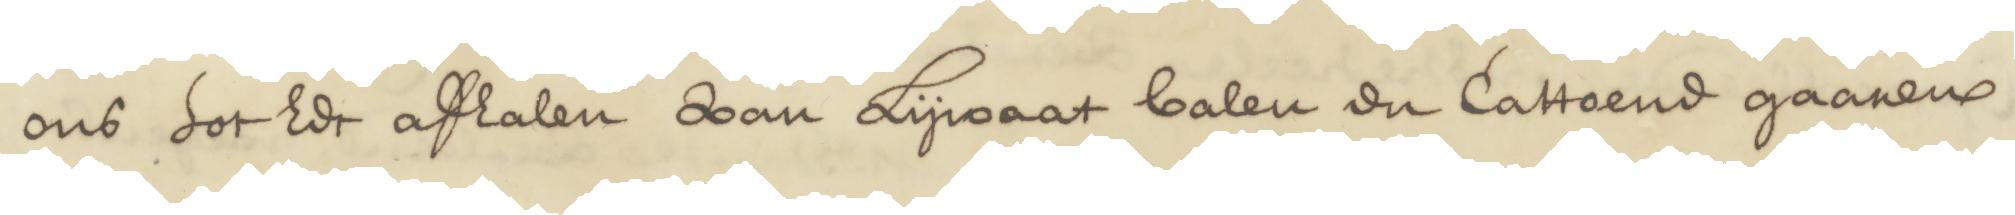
ons tot het afhalen van Lijwaat balen en Cattoene gaaren
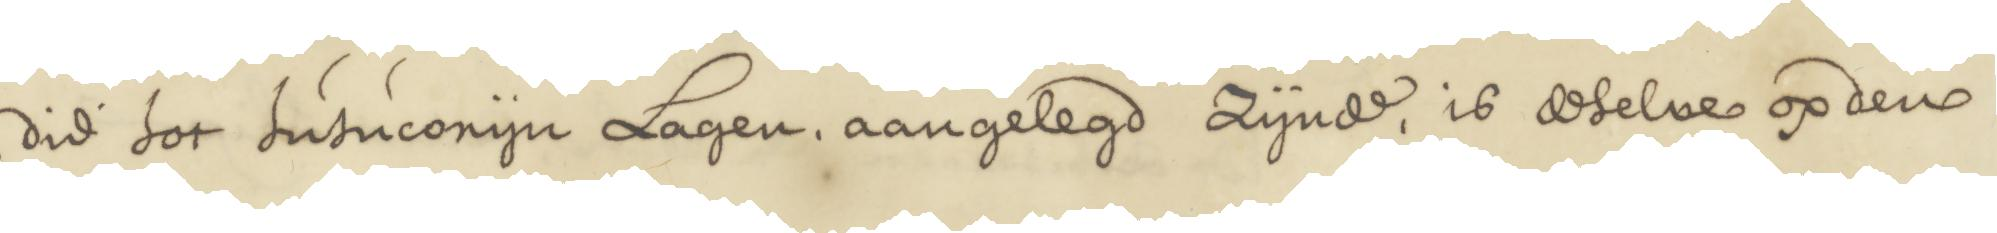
die tot tutucorijn Lagen, aangelegd zijnde, is deselve op den
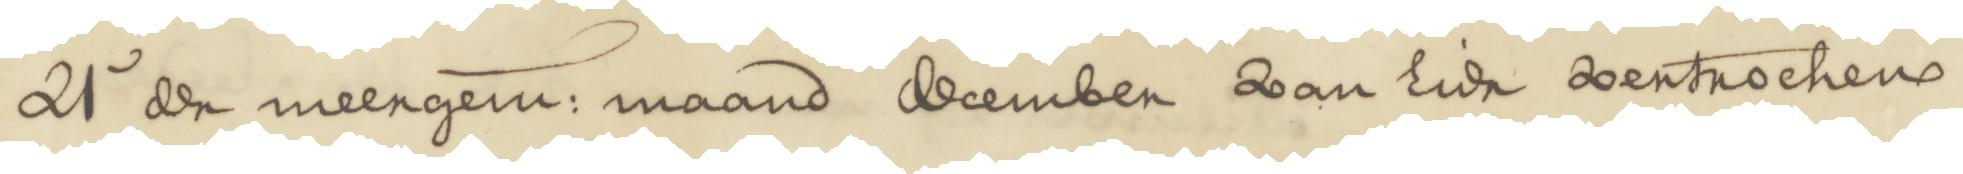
21' der meergem: maand december van hier vertroeken
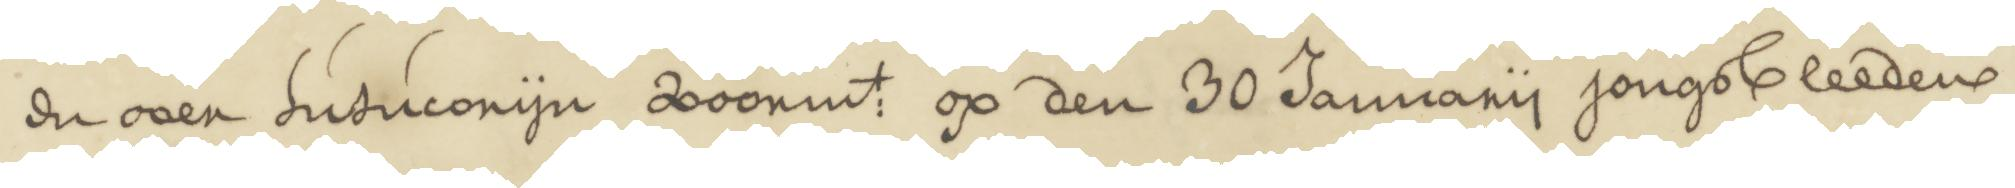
en over tutucorijn voorm:t op den 30 Januarij jongst leeden
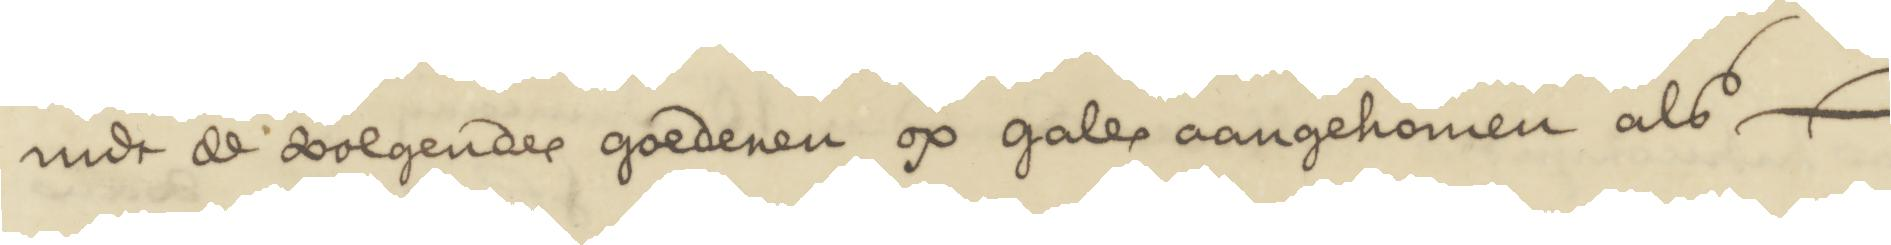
met de volgende goederen op gale aangekomen als
